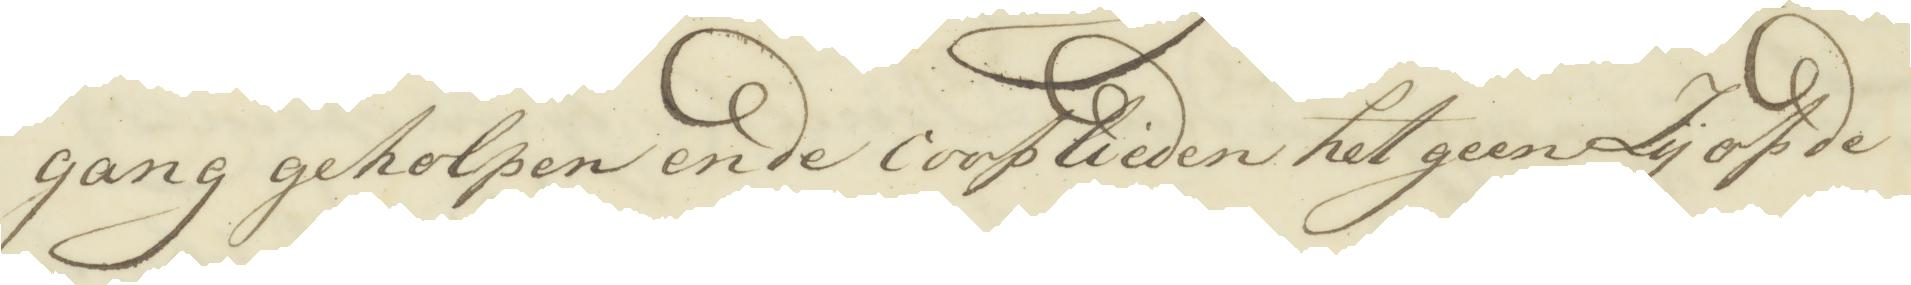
gang geholpen ende cooplieden het geen Zij op de
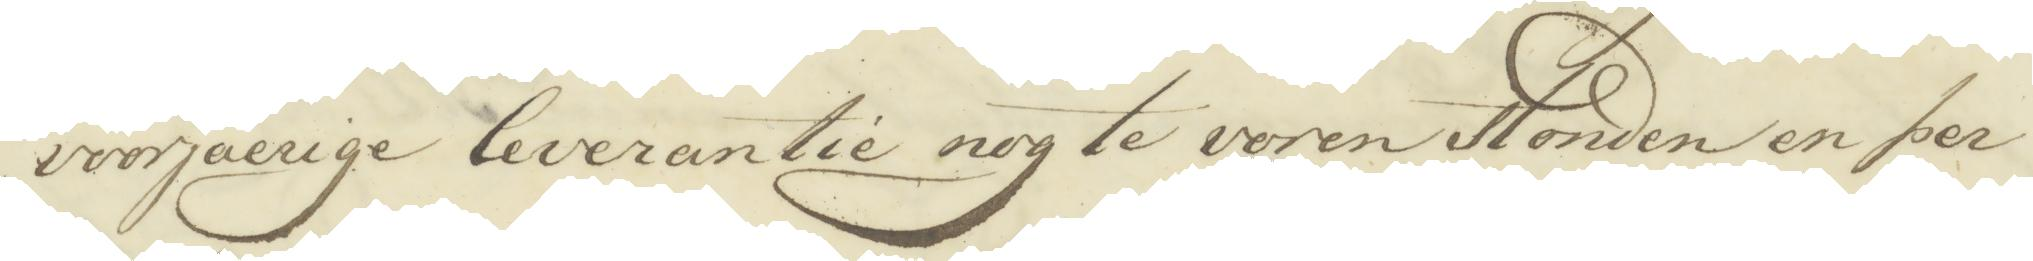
voorjaerige leverantie nog te voren Stonden en per
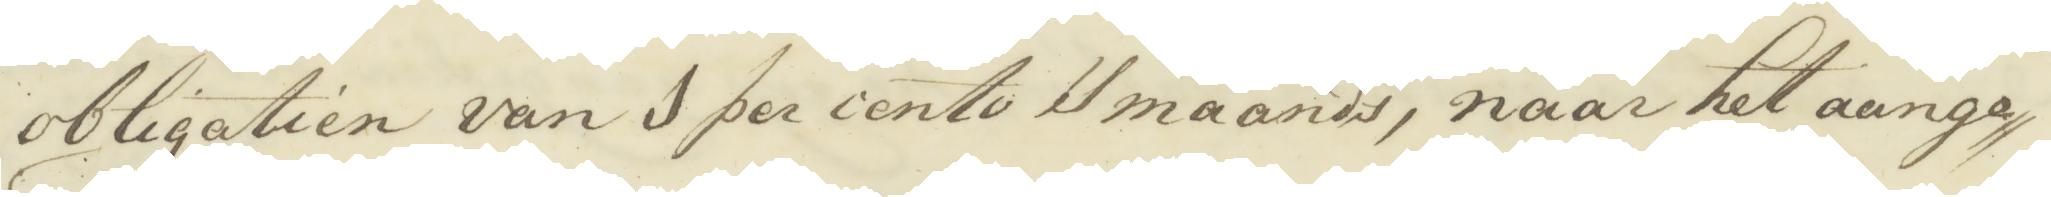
obligatien van 1 per cento 's maands, naar het aange„
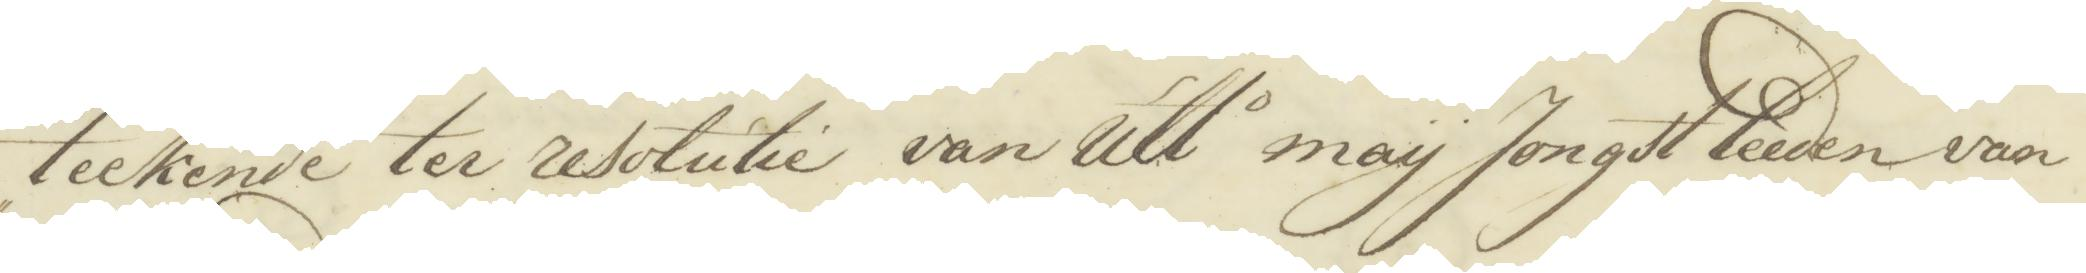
teekende ter resolutie van ult: o maij Jongst leeden van
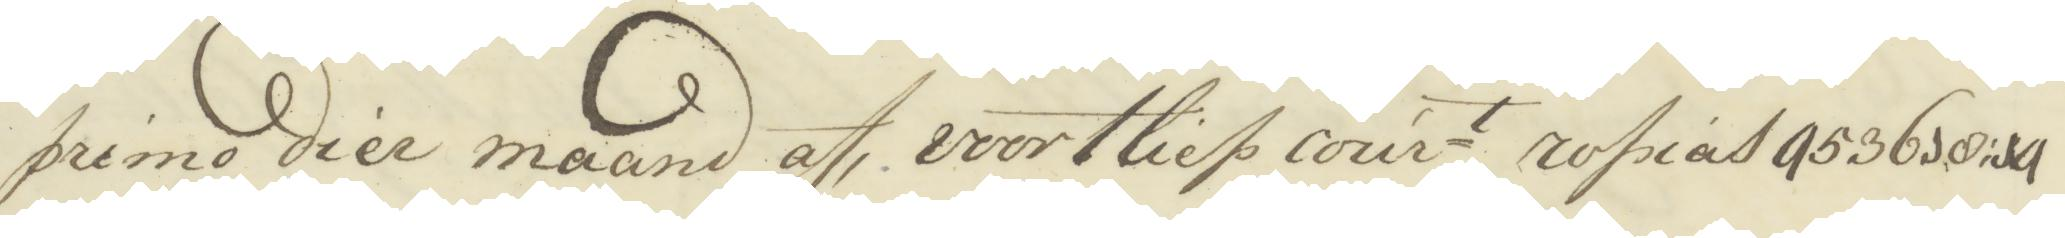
primo dier maand af, voort liep cour=t ropias 45361.8:14
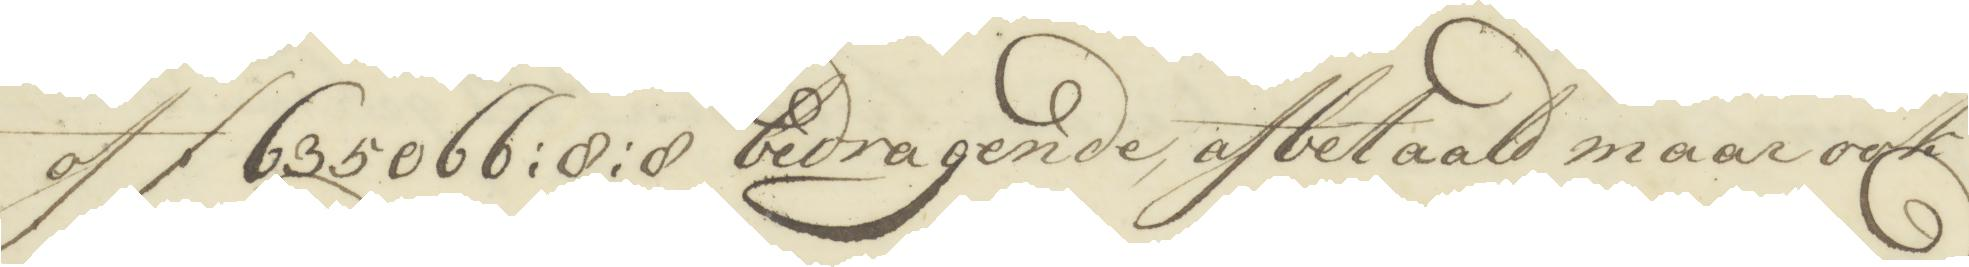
of ƒ 635066:8:8 bedragende, afbetaald maar ook
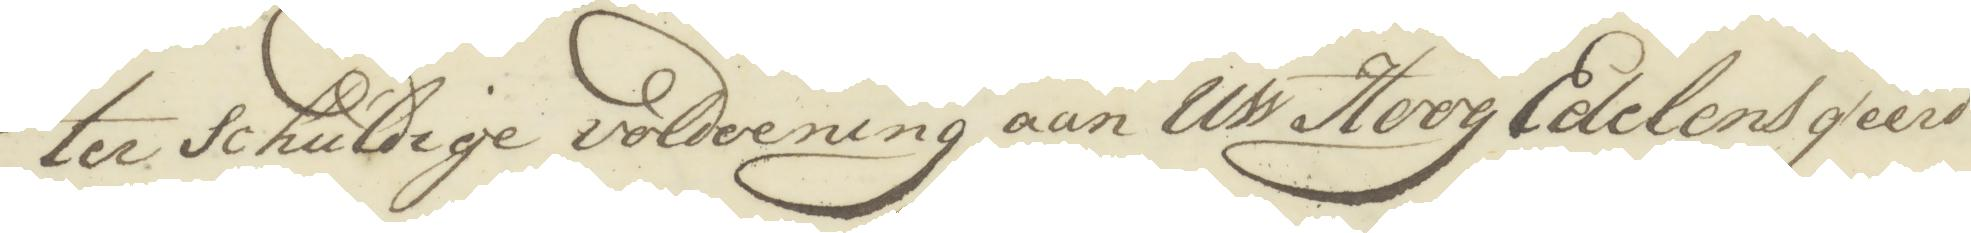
ter schuldige voldoening aan Uw Hoog Edelens g'eerd
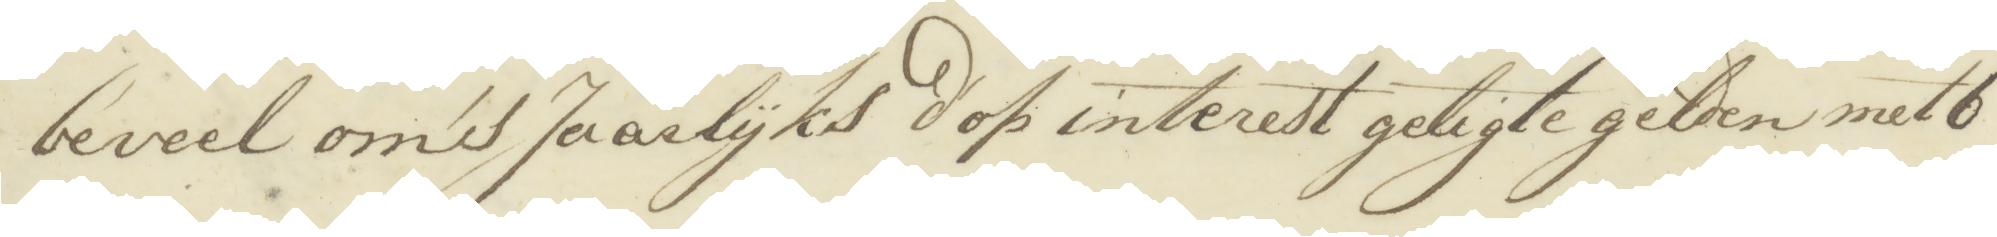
beveel om 's Jaarlijks d’op interest geligte gelden met 6
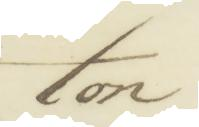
ton
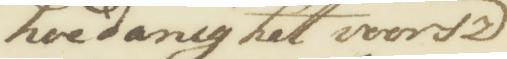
hoedanig het voorsz
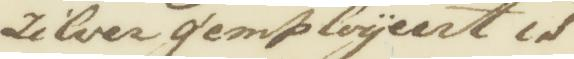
Zilver gemploijeert is
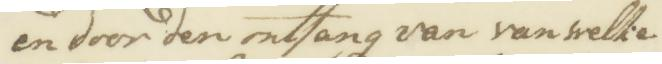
en door den ontfang van van welke
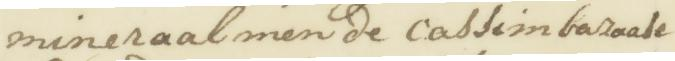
mineraal men de Cassimbazaase
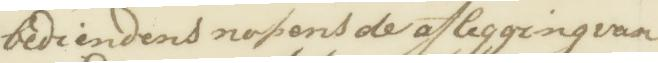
bediendens nopens de aflegging van
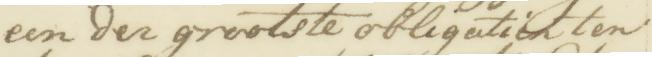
een der grootste obligatien ten
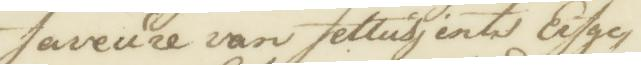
faveure van fettusjents Erfge„
